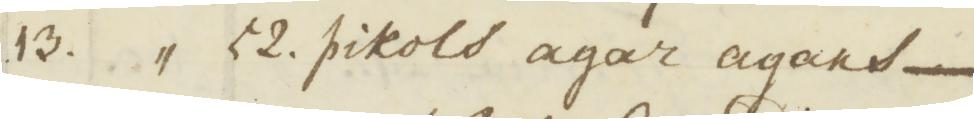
13. „ 52. pikols agar agars —
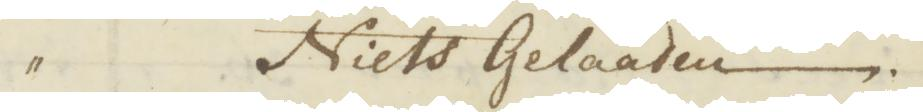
„ Niets Gelaaden.
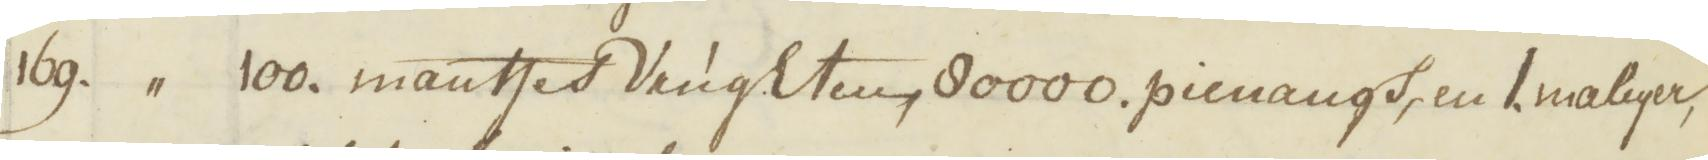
169. „ 100. mantjes Vrughten, 80000. pienangs, en 1. maleyer,
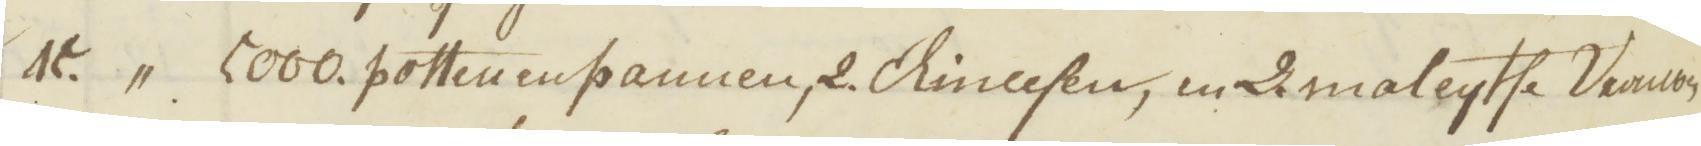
45. „ 5000. pottenenpannen, 2. Chineesen, en 2. maleijtse Vrouwen
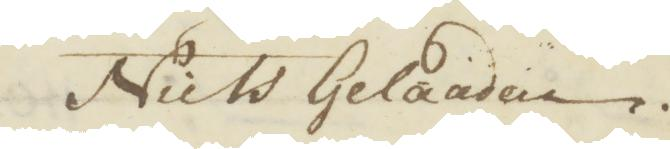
Niets Gelaaden
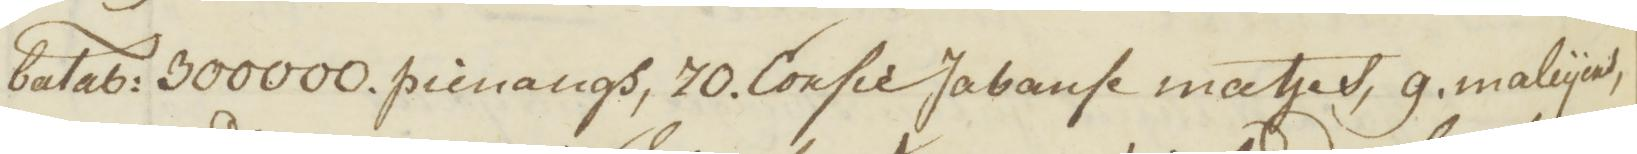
batav: 300000. pienangs, 70. Corsie Javanse matjes, 9. maleijers,
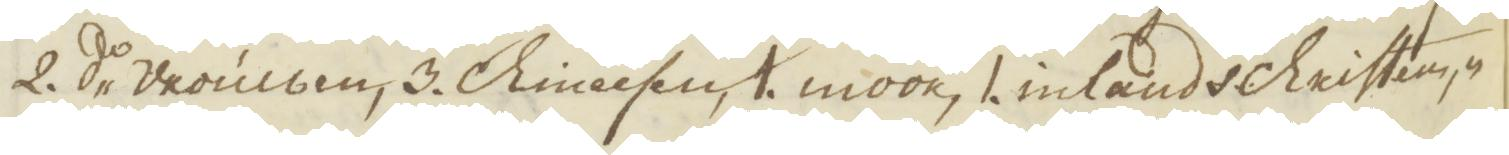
2. d„o Vrouwen, 3. Chineesen, 1. moor, 1. inlands christen, en
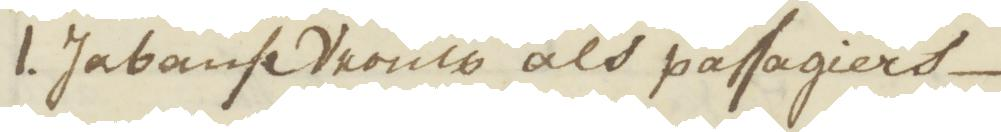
1. Javanse Vrouw als passagiers —
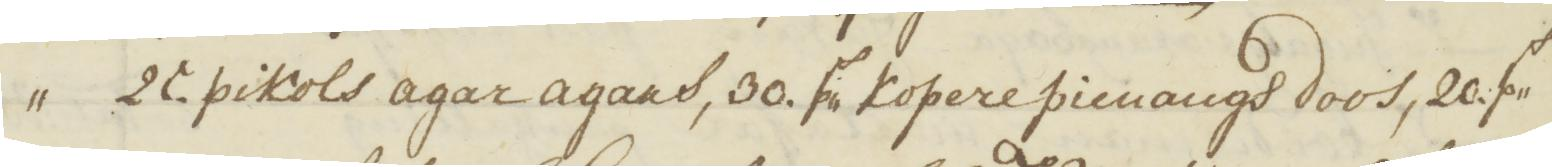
„ 25. pikols agar agars, 30. p„s kopere pienangs doos, 20. p„s
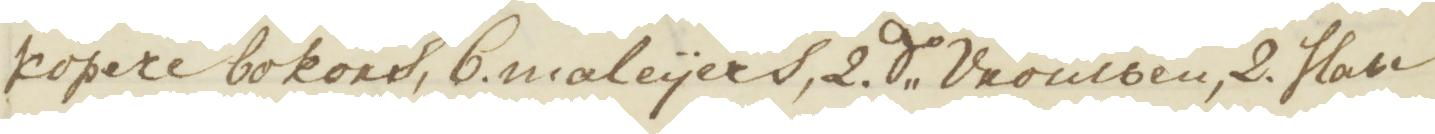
kopere bokors, 6. maleijers, 2. d„o Vrouwen, 2. slave
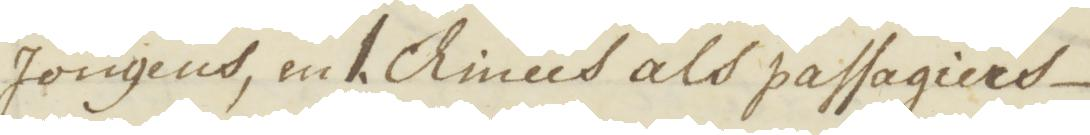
Jongens, en 1. Chinees als passagiers —
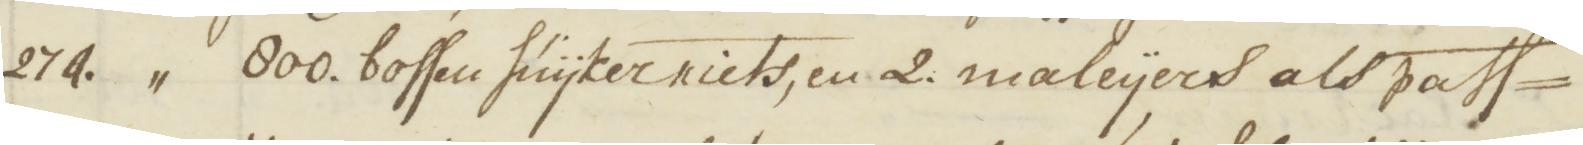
274. „ 800. bossen suijkerriets, en 2: maleijers als pass=s
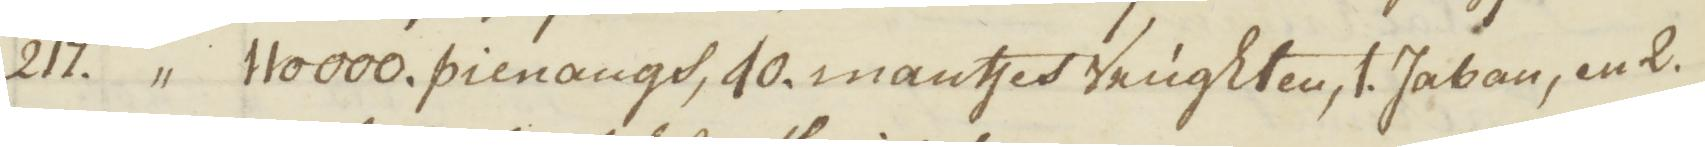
217. „ 110000. pienangs, 40. mantjes Vrughten, 1. Javan, en 2.
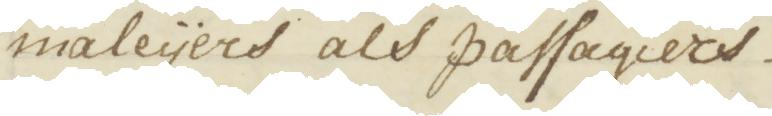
maleijers als passagiers —
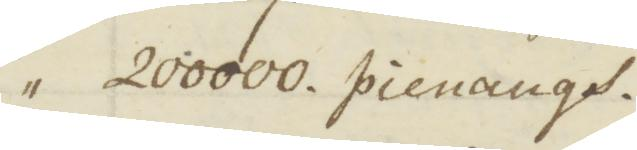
„ 200000. pienangs.
